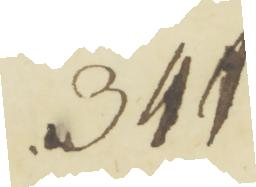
341
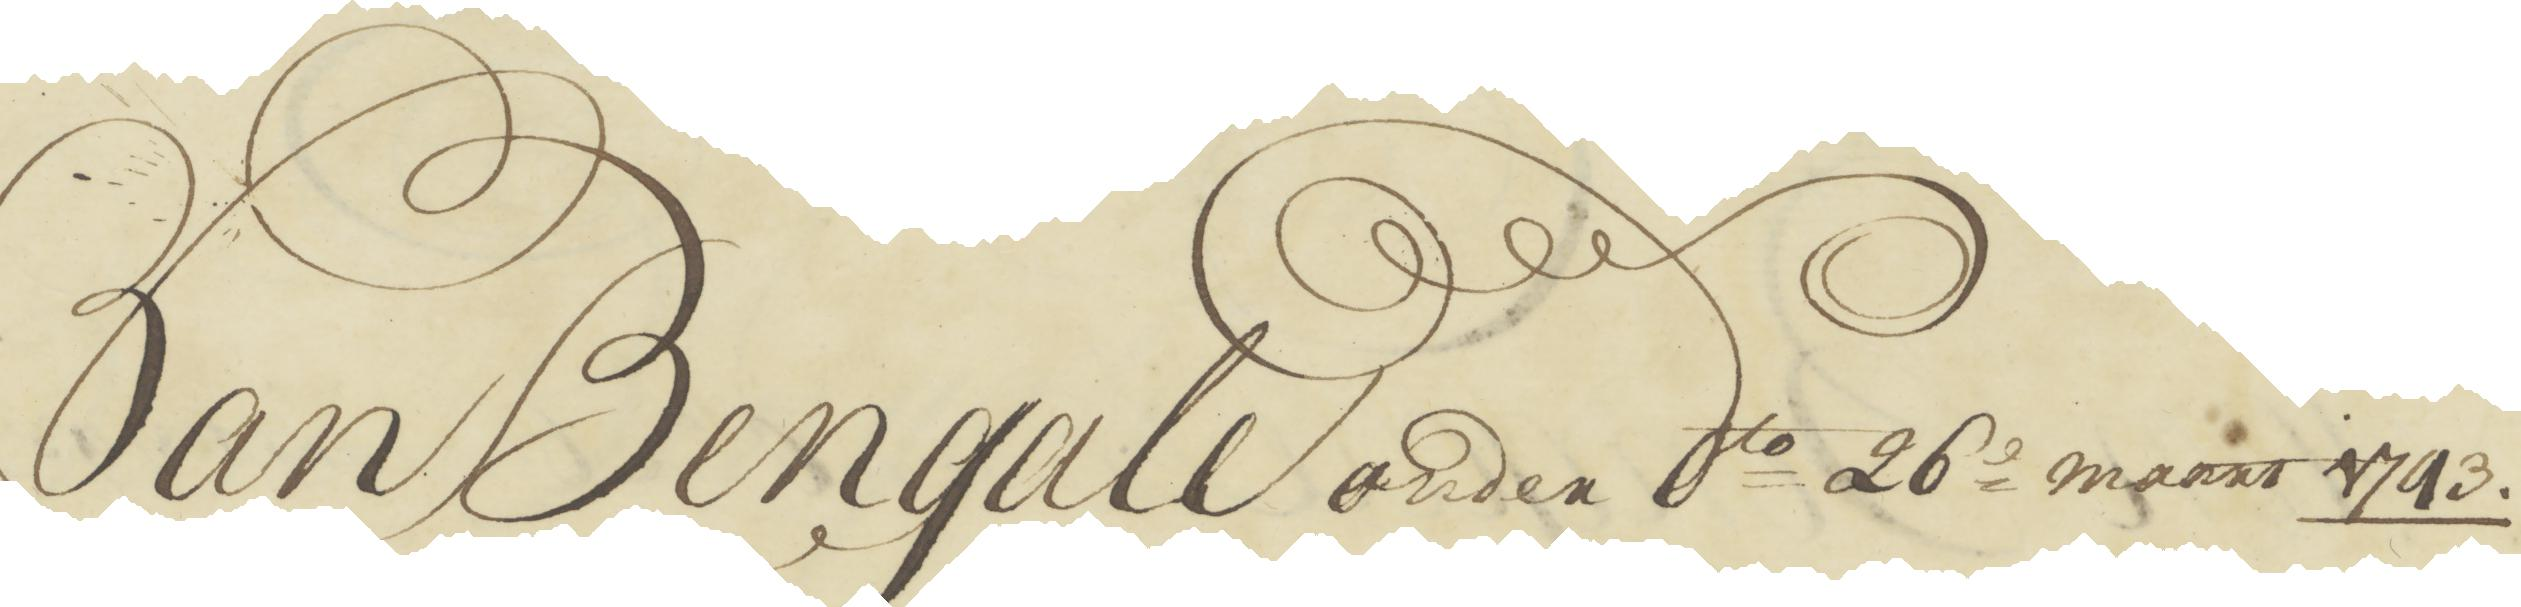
Van Bengale onder d=to 26=e maart 1743.
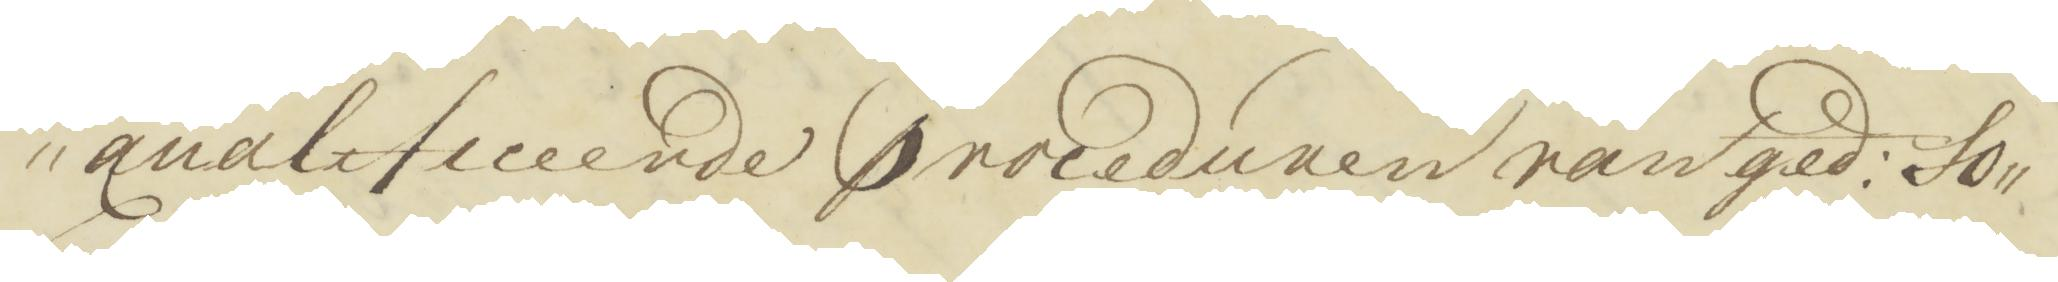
„qualificeerde proceduren van ged: So„
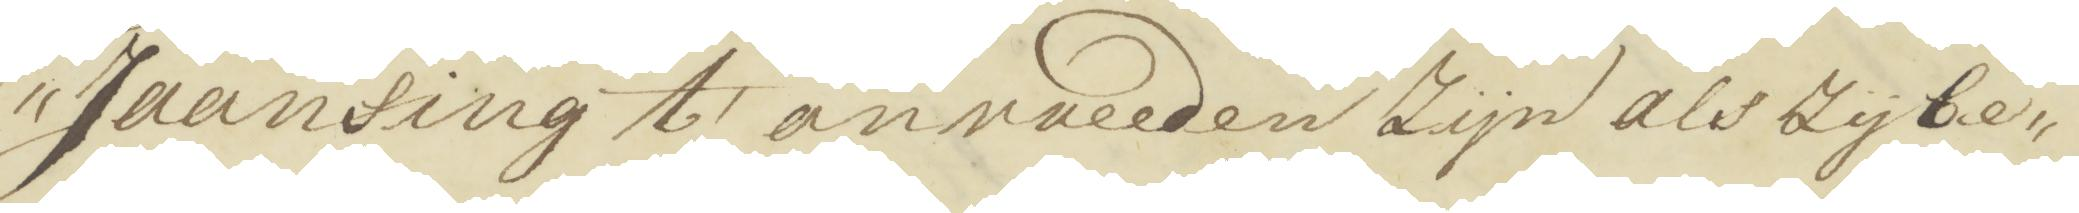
„Jaansing t' onvreeden Zijn als zij be„
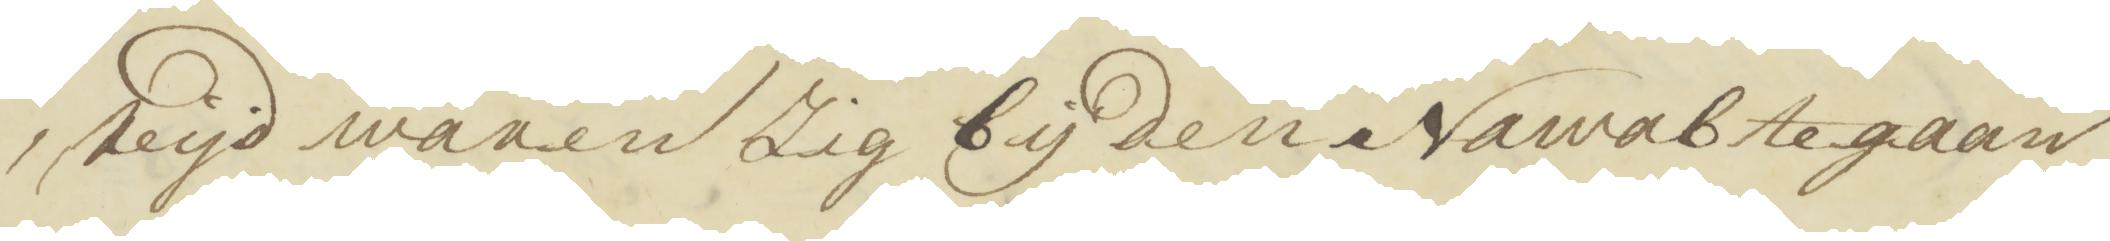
„reijd waren Zig bij den Nawab te gaan
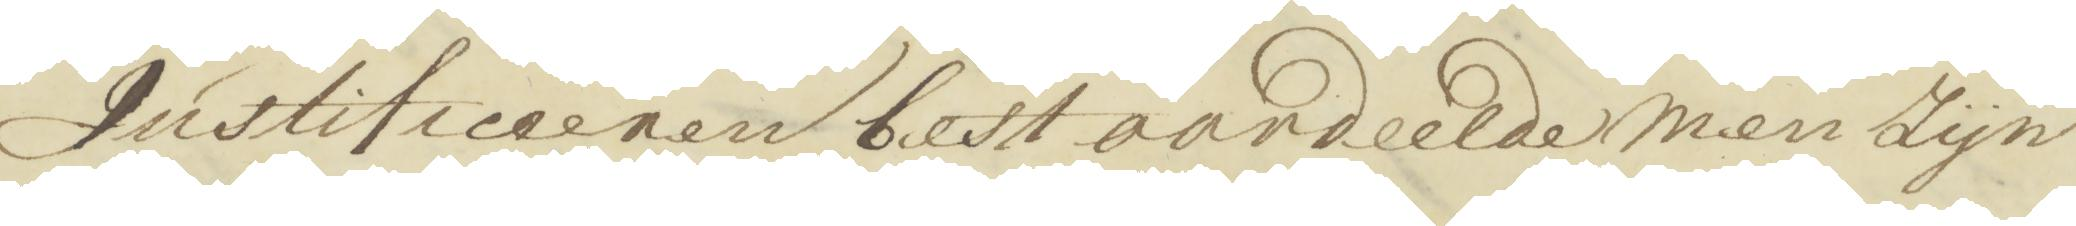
Justificeeren best oordeelde men Zijn
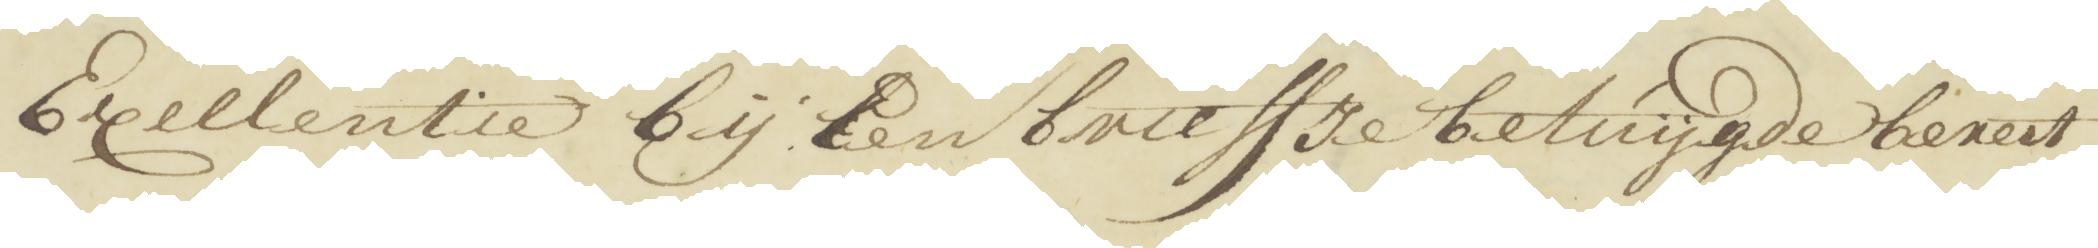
Exellentie bij Een brieffje betuijgde bereit
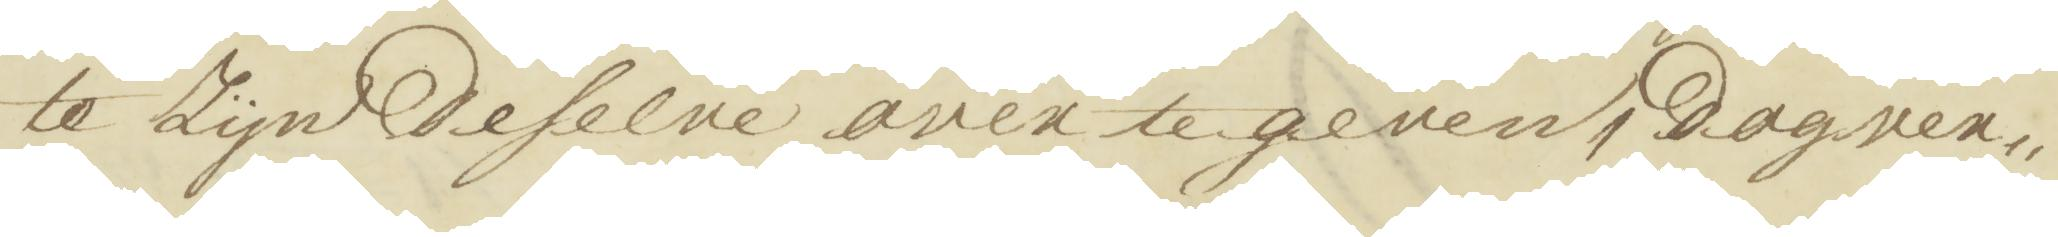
te Zijn deselve over te geven, dog ver„
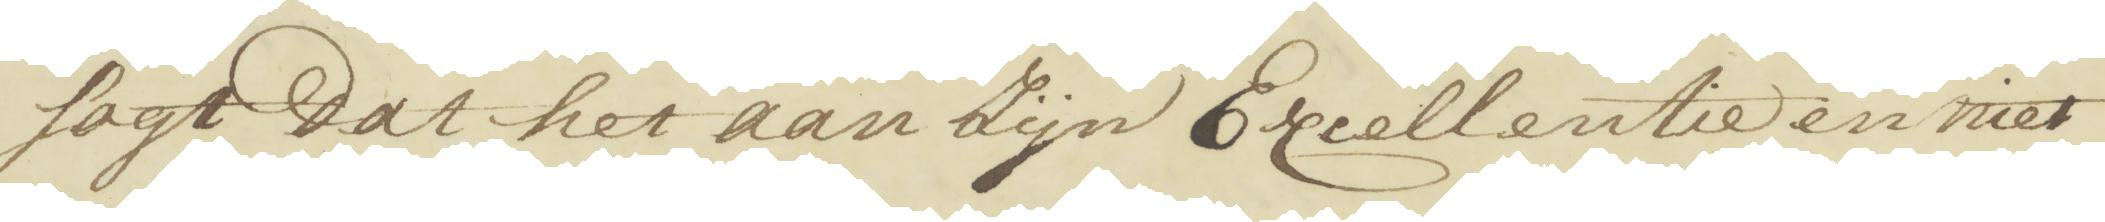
sogt dat het aan Zijn Excellentie en niet
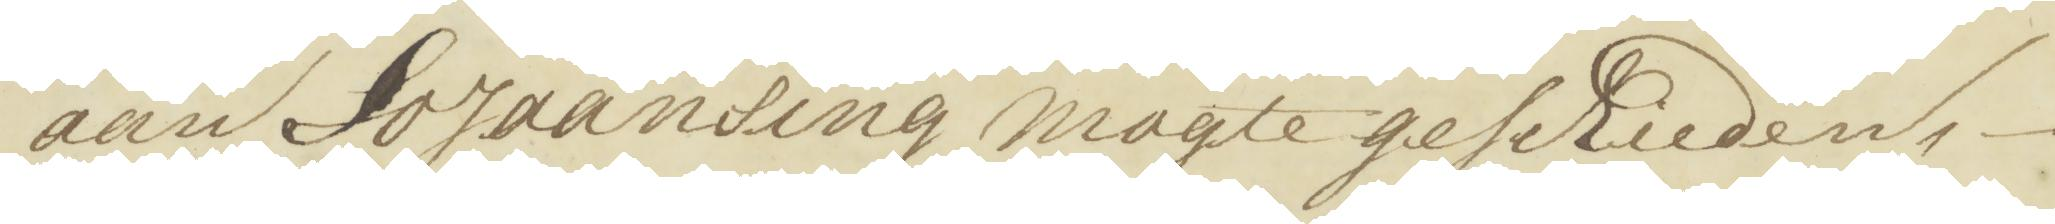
aan Sojaansing mogte geschieden, —
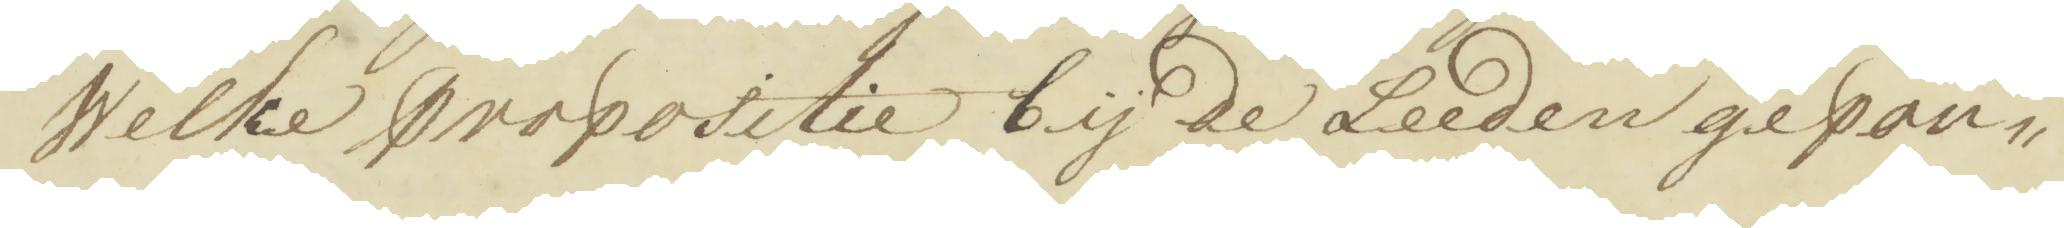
welke propositie bij de Leeden gepon„
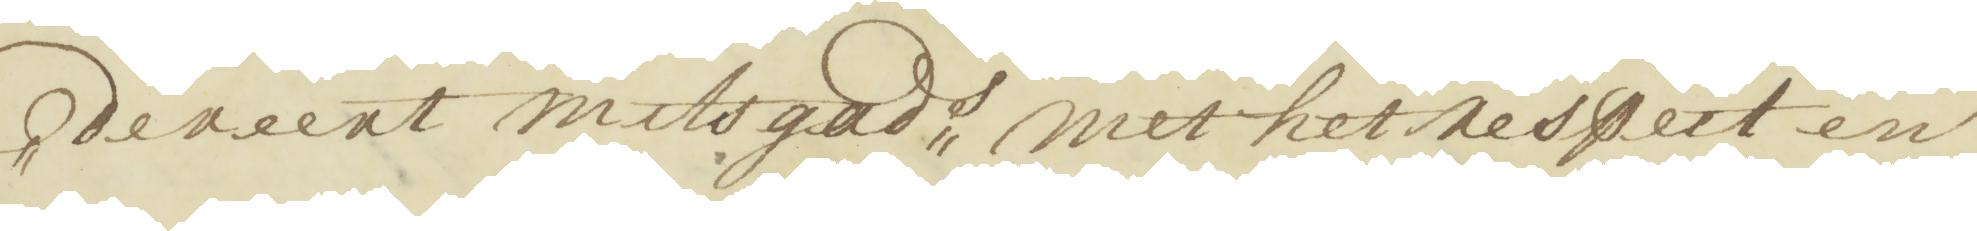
„dereert mitsgad„s met het respect en
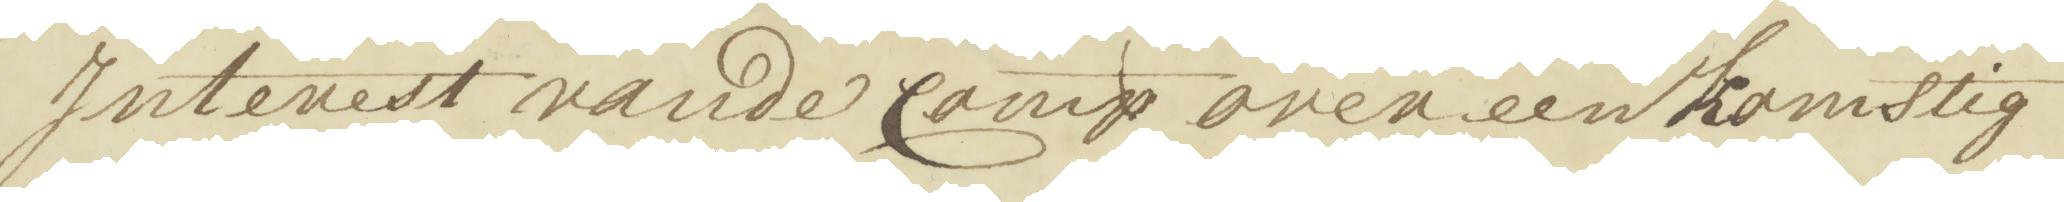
Jnterest vande Comp over eenkomstig
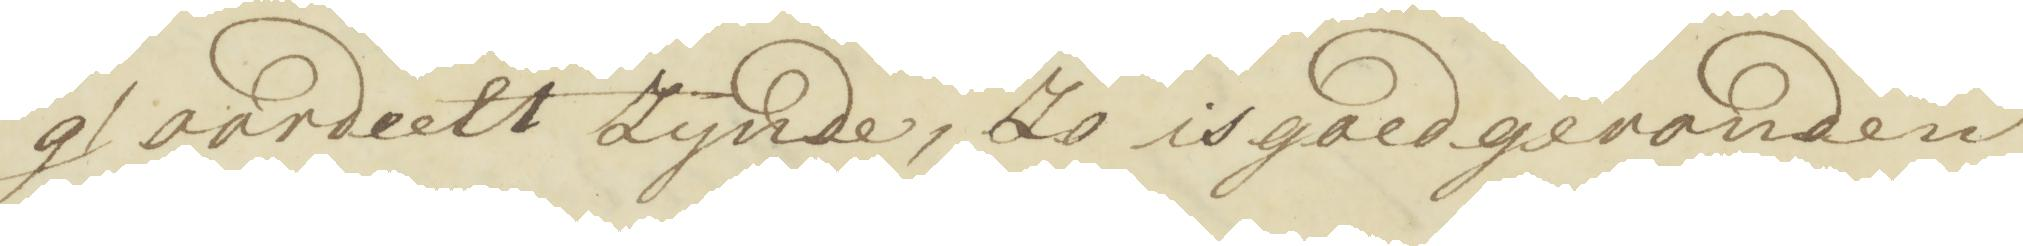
g’ oordeelt Zijnde, zo is goed gevonden
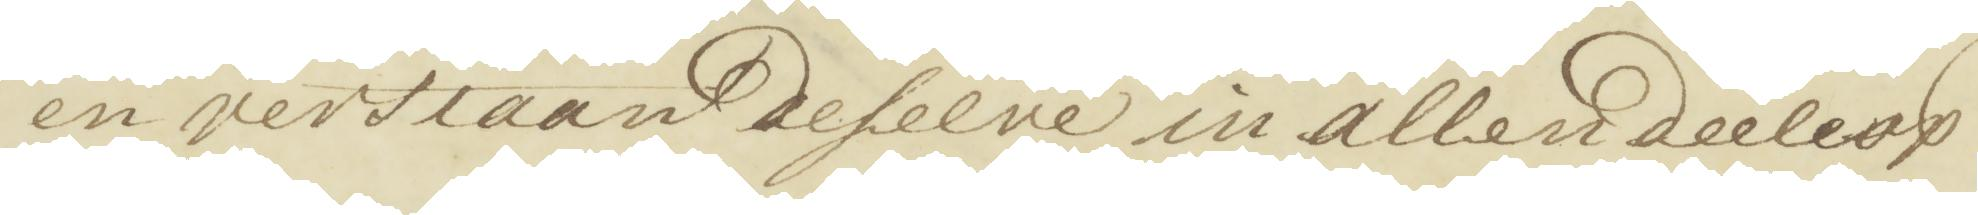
en verstaan deselve in allen deele op
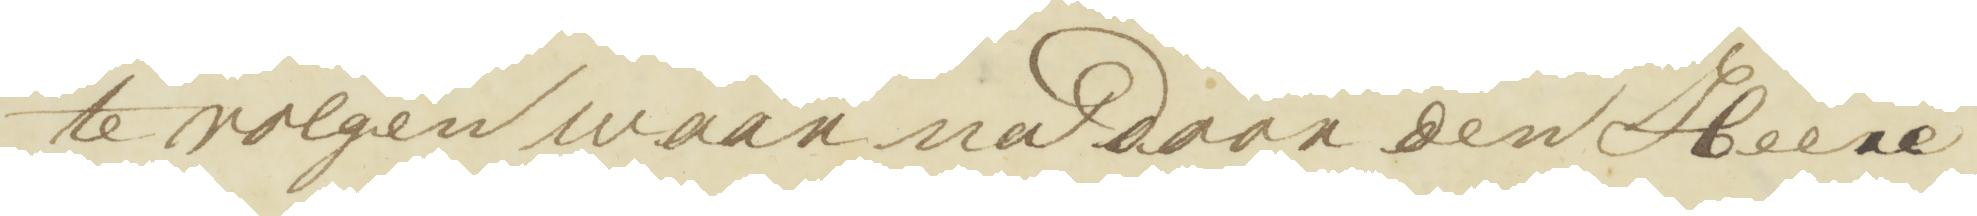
te volgen waarna door den Heere
